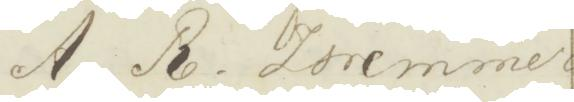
A R. Zwemmer
